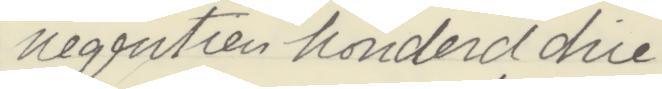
negentien honderd drie
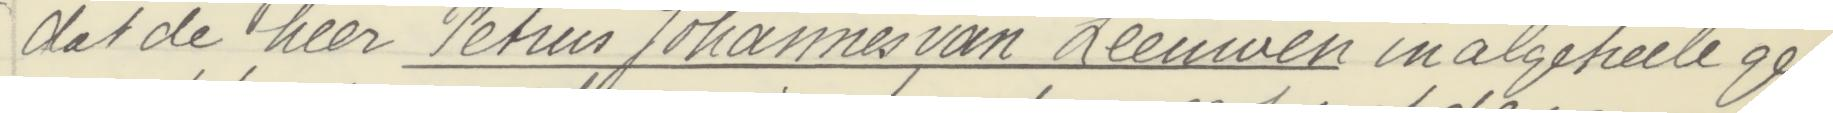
dat de heer Petrus Johannes van Leeuwen in algeheele ge-
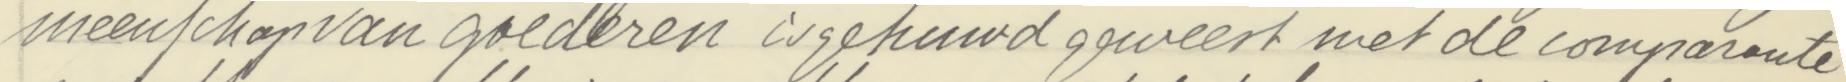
meenschap van goederen is gehuwd geweest met de comparante
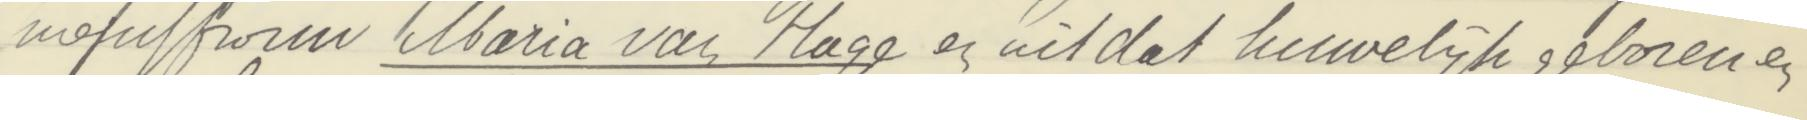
mejuffrouw Maria van Hage en uit dat huwelijk geboren en
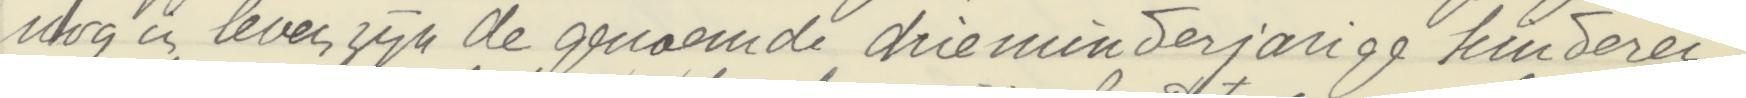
nog in leven zijn de genoemde drie minderjarige kinderen
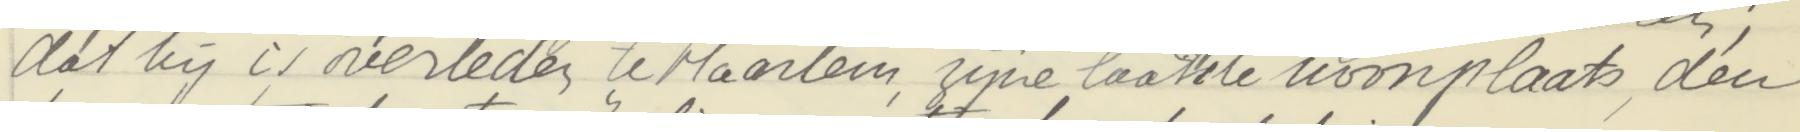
dat hij is overleden te Haarlem, zijne laatste woonplaats, den
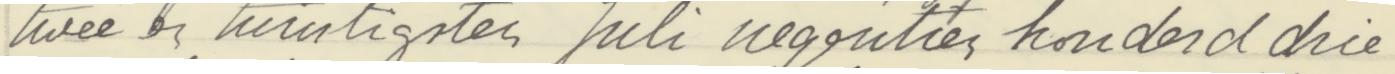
twee en twintigsten Juli negentien honderd drie
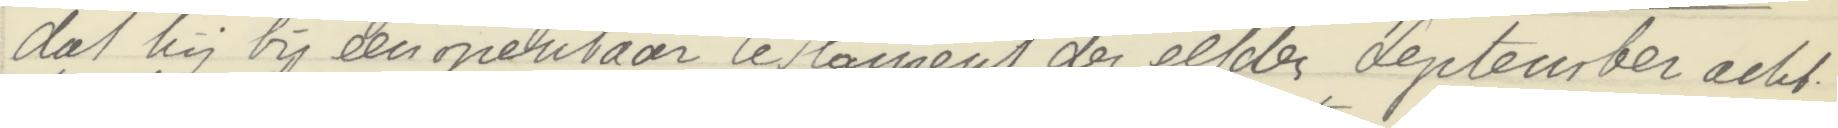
dat hij bij een openbaar testament den elfden September acht
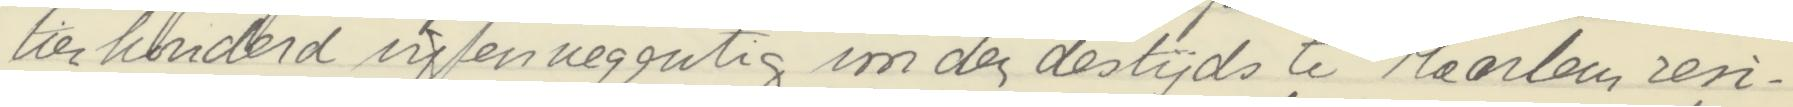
tien honderd vijfen negentig voor den destijds te Haarlem resi-
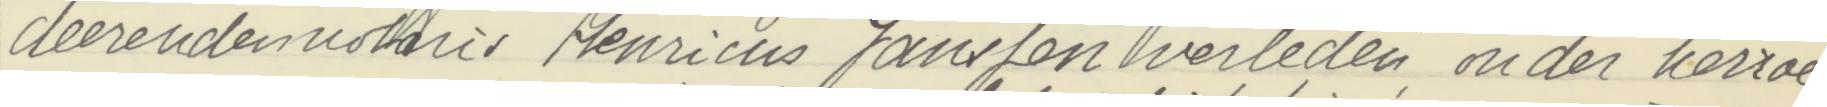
deerenden notaris Henricus Janssen verleden, onder herroe
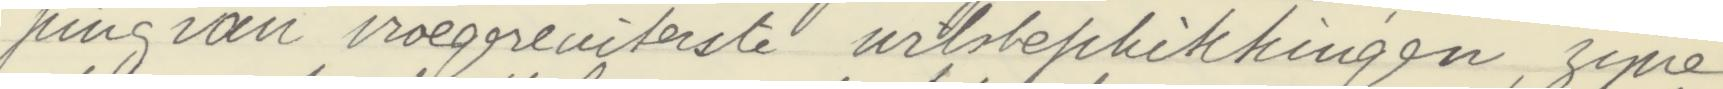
ping van vroegere uiterste wilsbeschikkingen, zijne
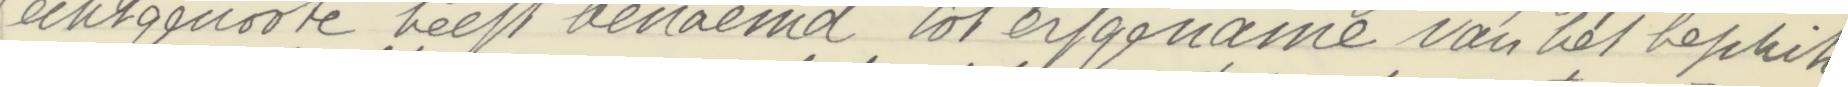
echtgenoote heeft benoemd tot erfgename van het beschik
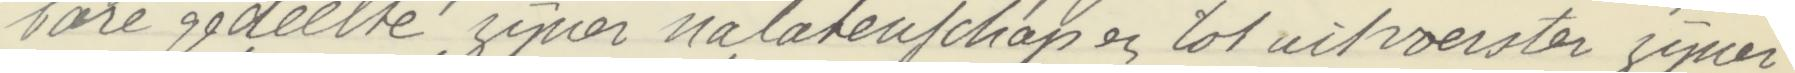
bare gedeelte zijner nalatenschap en tot uitvoerster zijner
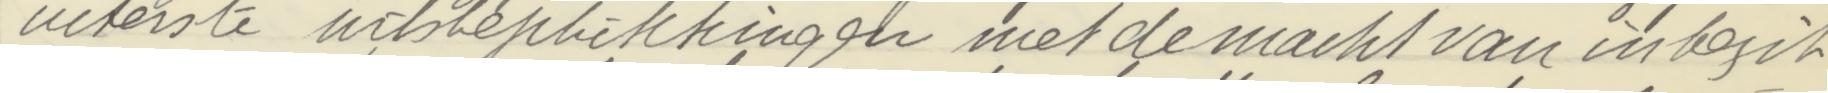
uiterste wilsbeschikkingen met de macht van inbezit
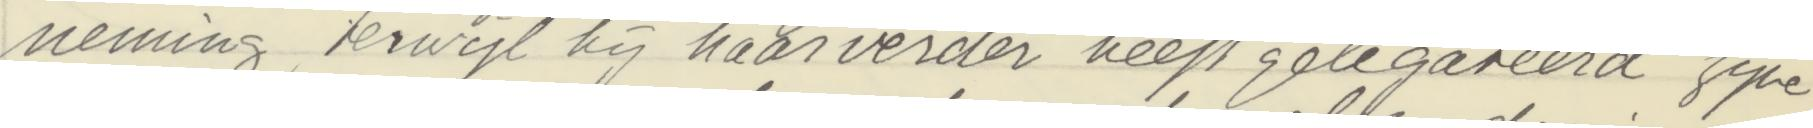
neming, terwijl hij haar verder heeft gelegateerd zijne
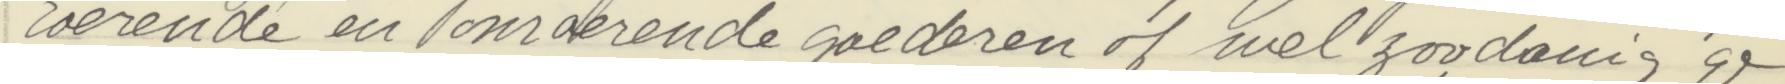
roerende en onroerende goederen of wel zoodanig ge
